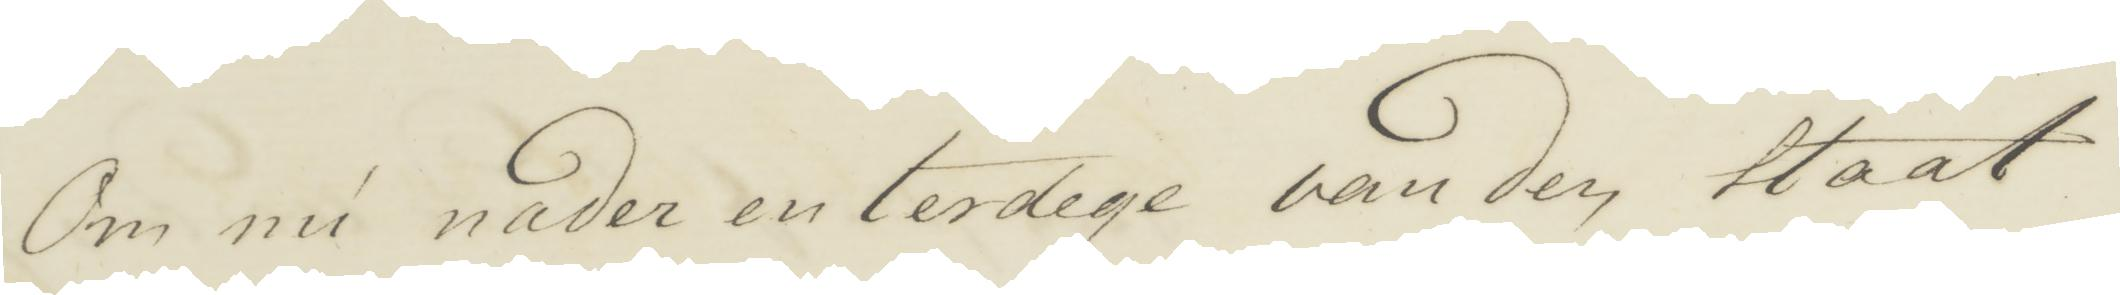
Om nu nader en terdege van den staat
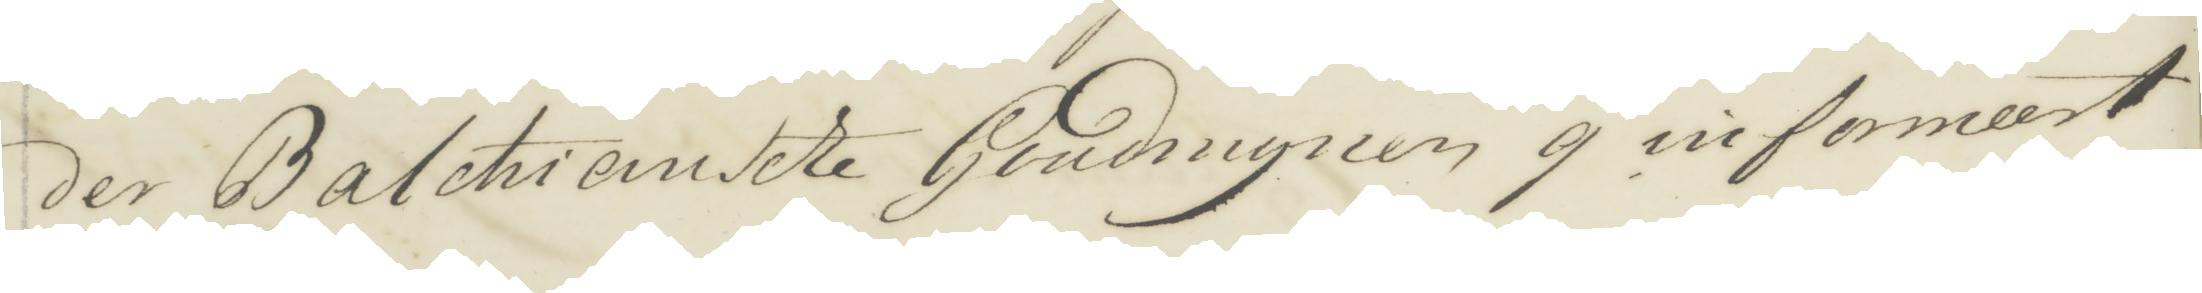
der Batchiansche Goudmynen g’informeert
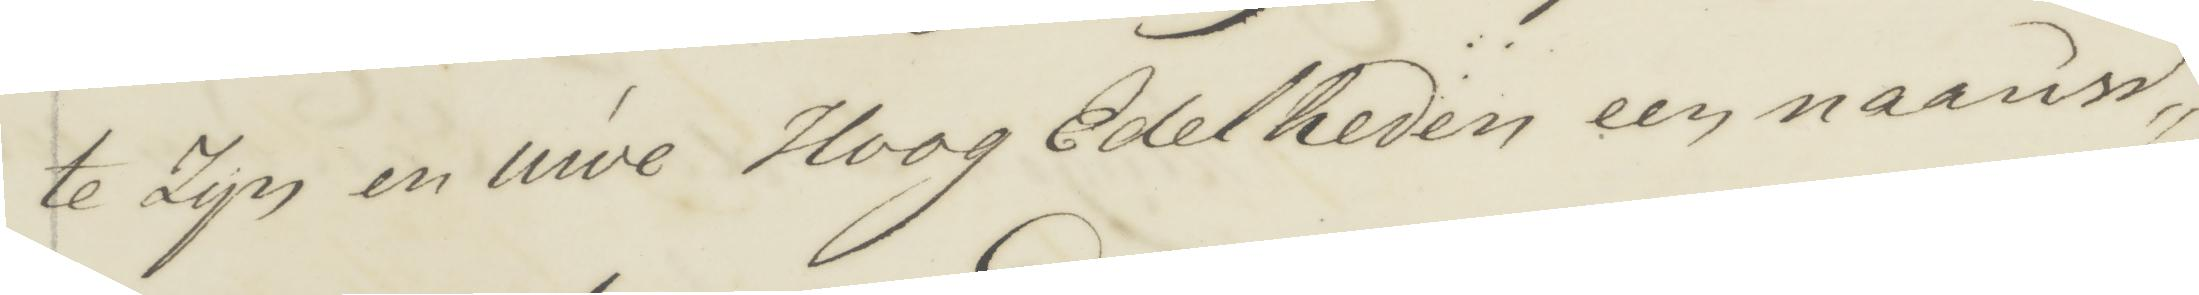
te zyn en uwe Hoog Edelheden een naauw„
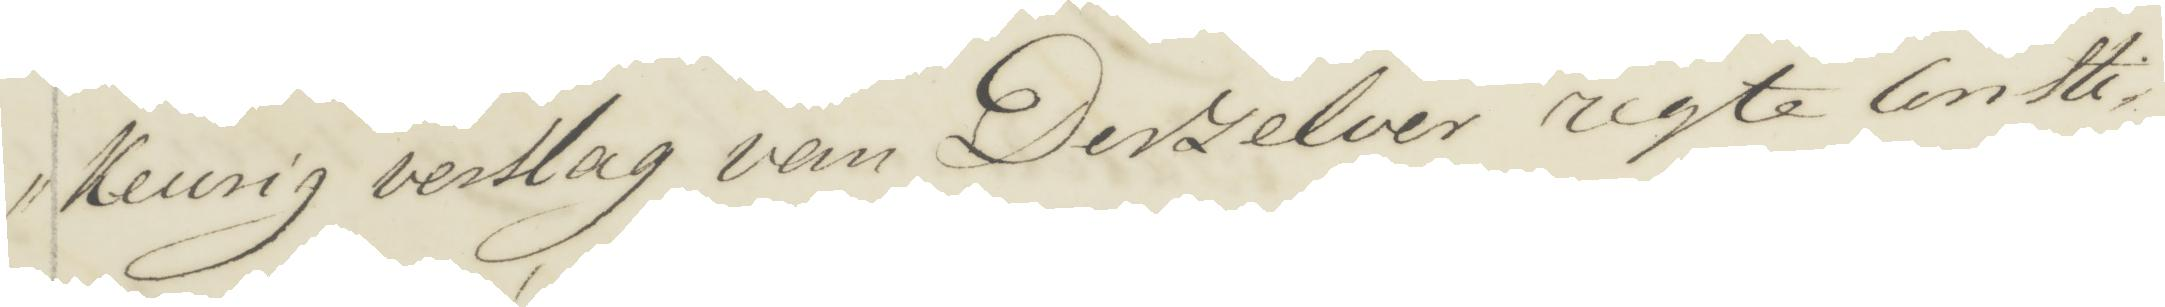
„keurig verslag van Derzelver regte consti„
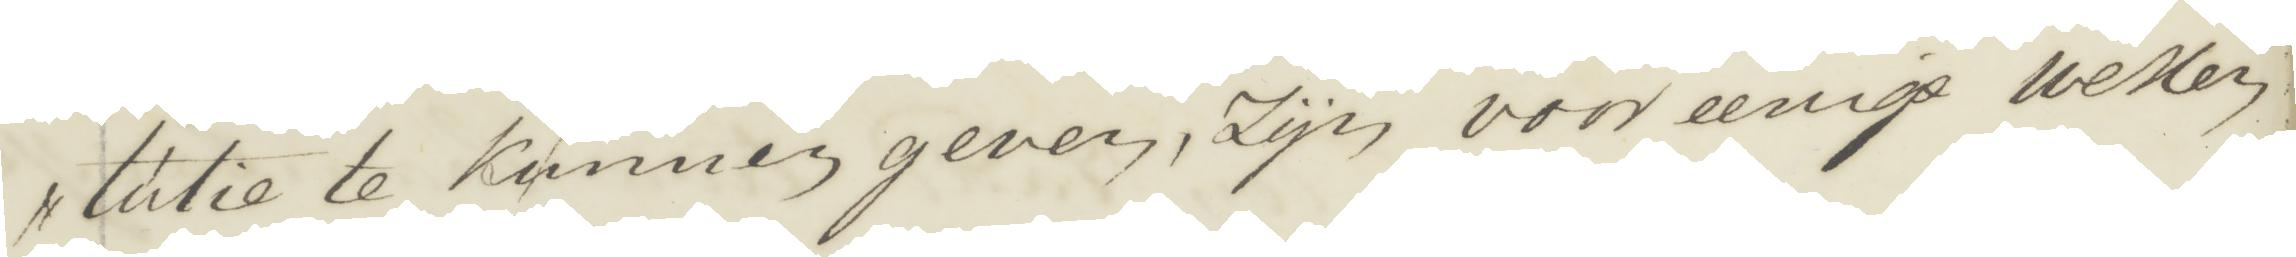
„tutie te kunnen geven, zijn voor eenige weken
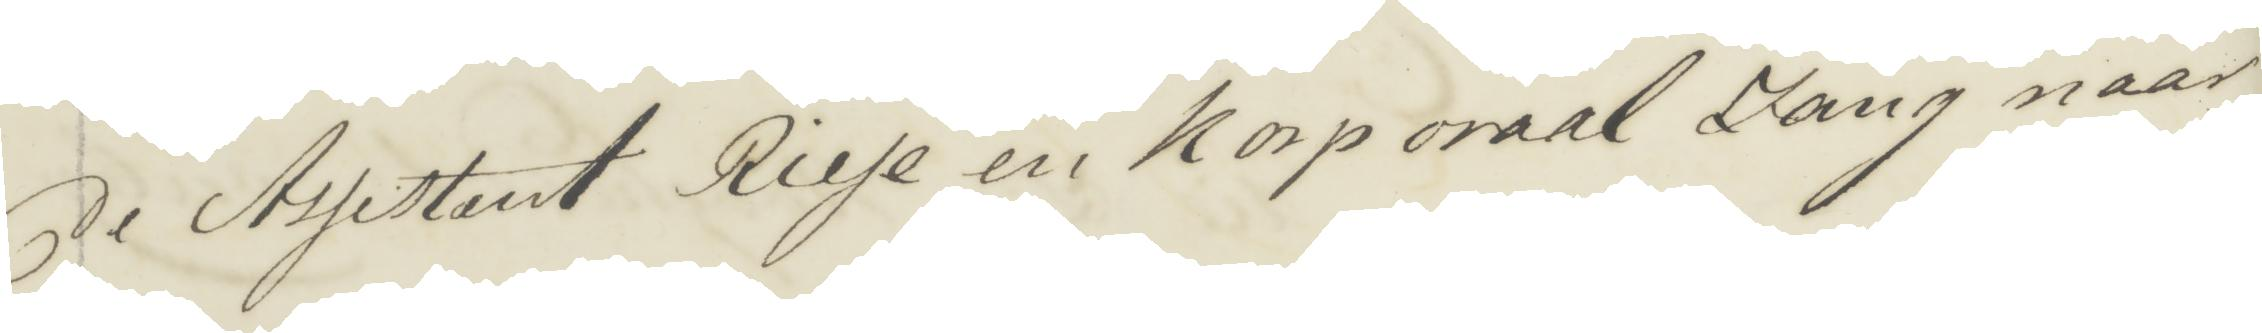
de Assistent Riese en korporaal zang naar
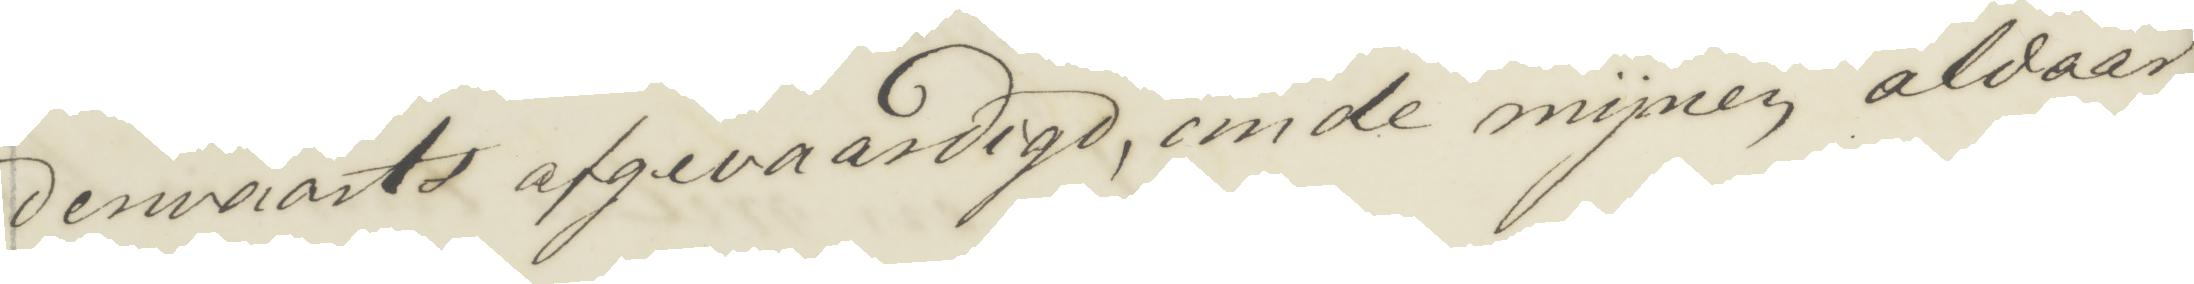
derwaarts afgevaardigd, om de mijnen aldaar
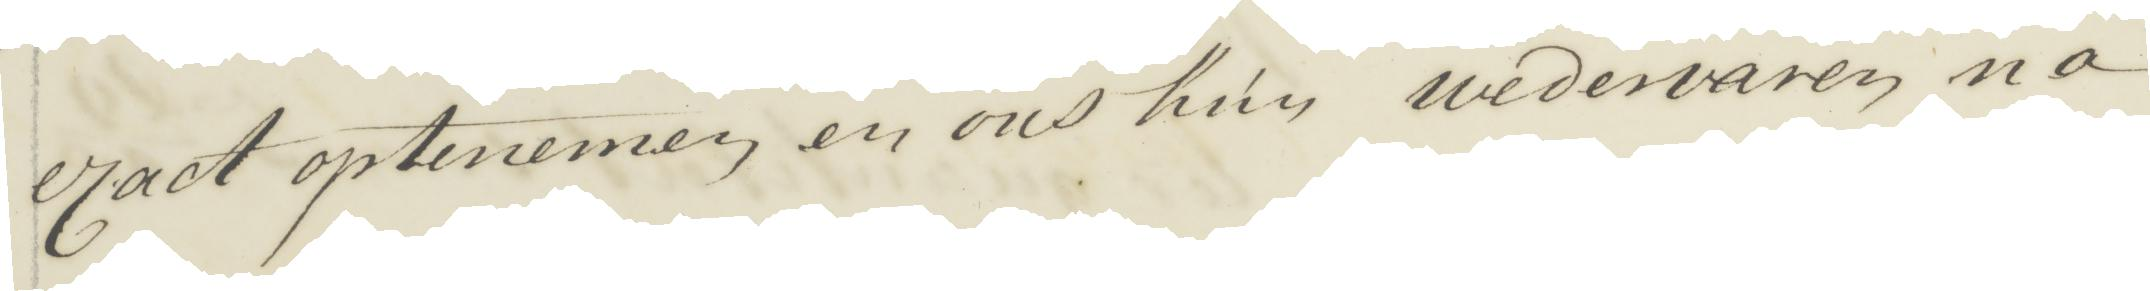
exact optenemen en ons hun wedervaren na
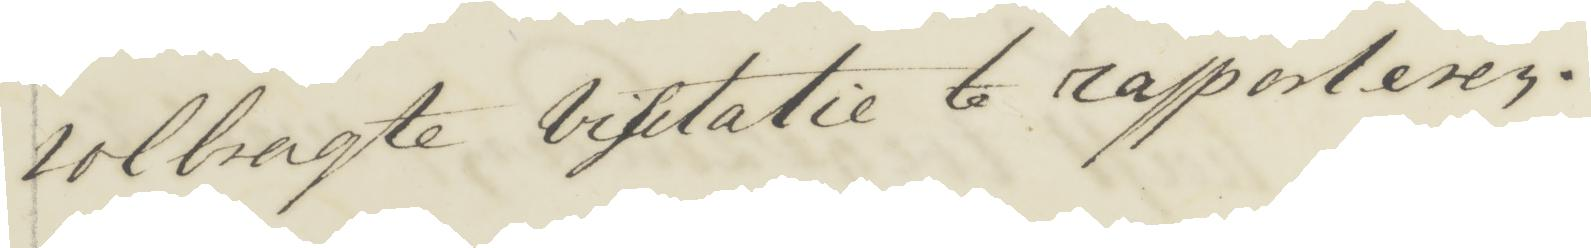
volbragte visitatie te rapporteren.
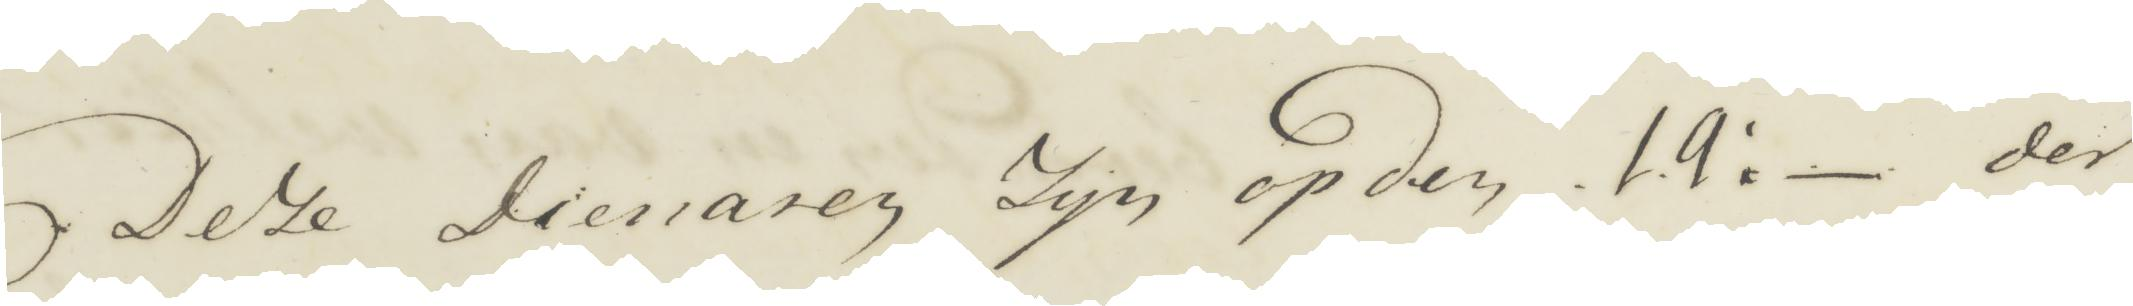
Deze dienaren zijn op den . 14: — der
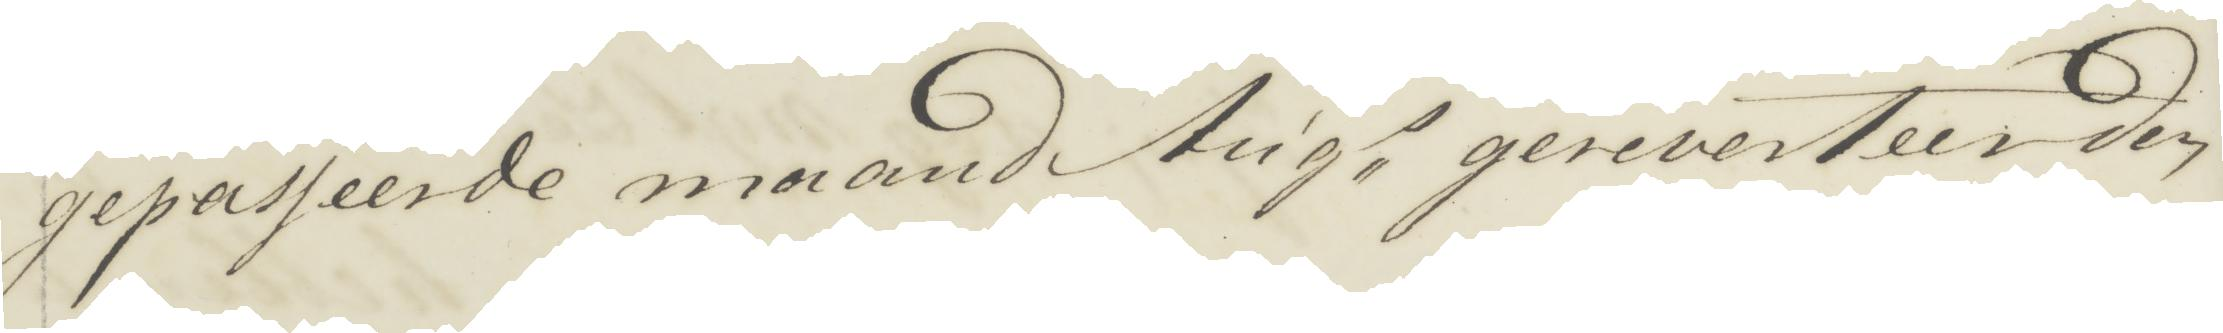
gepasseerde maand Aug„s gereverteerd en
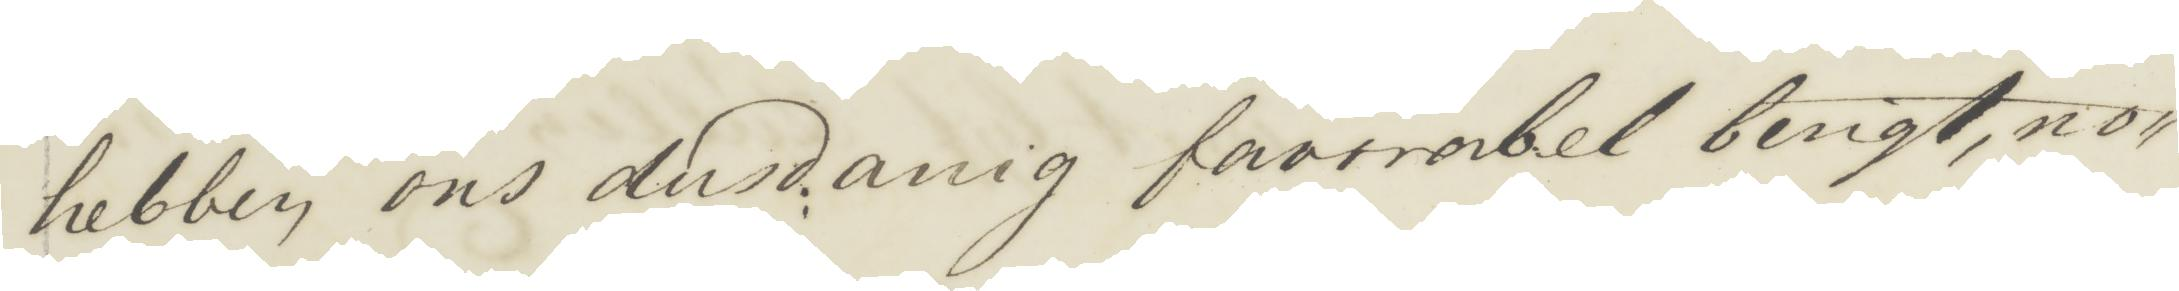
hebben ons dusdanig favorabel berigt, no„
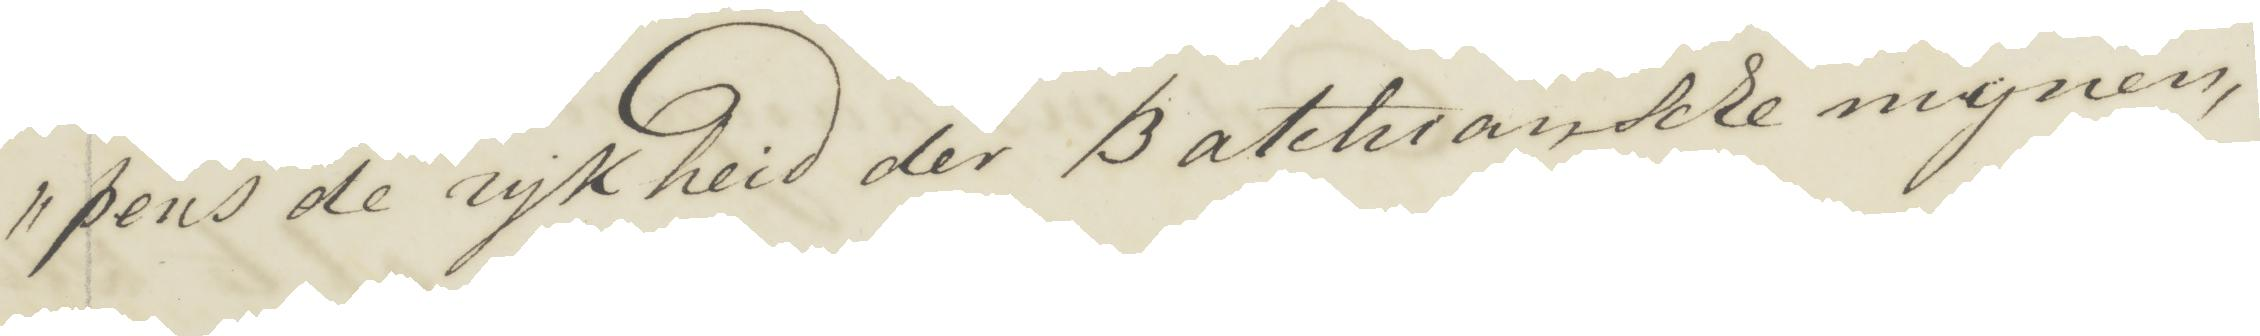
„pens de rijkheid der Batchiansche mynen,
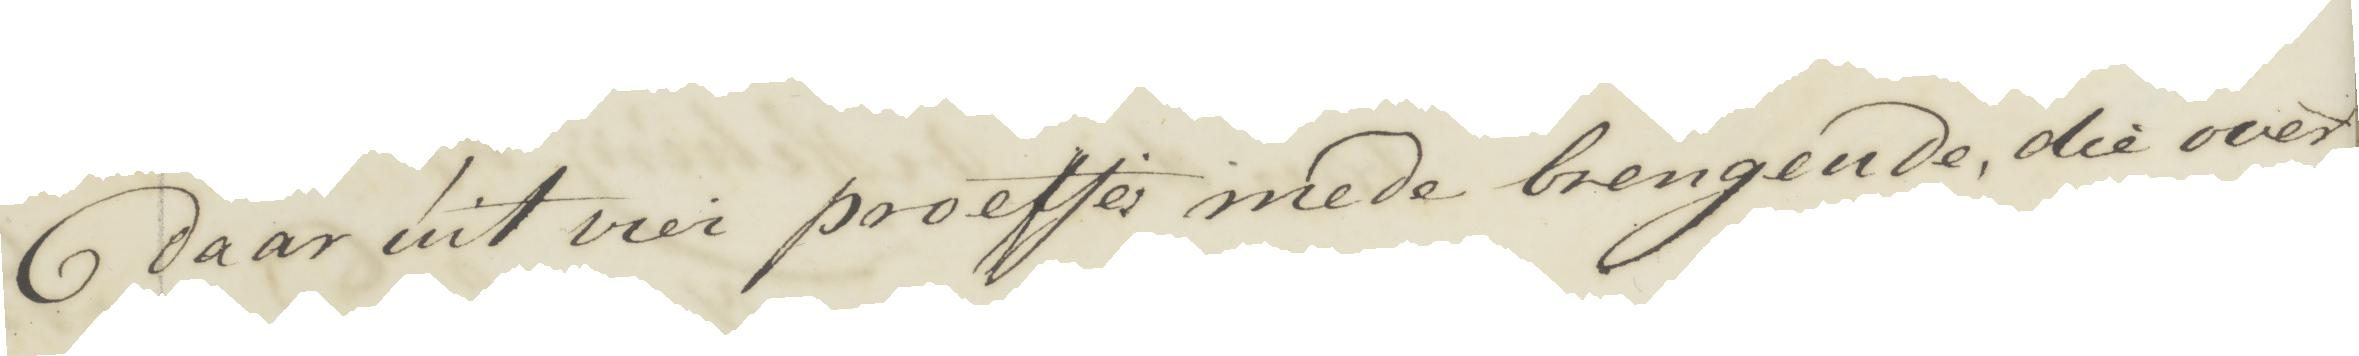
daar uit vier proefjes mede brengende, die over
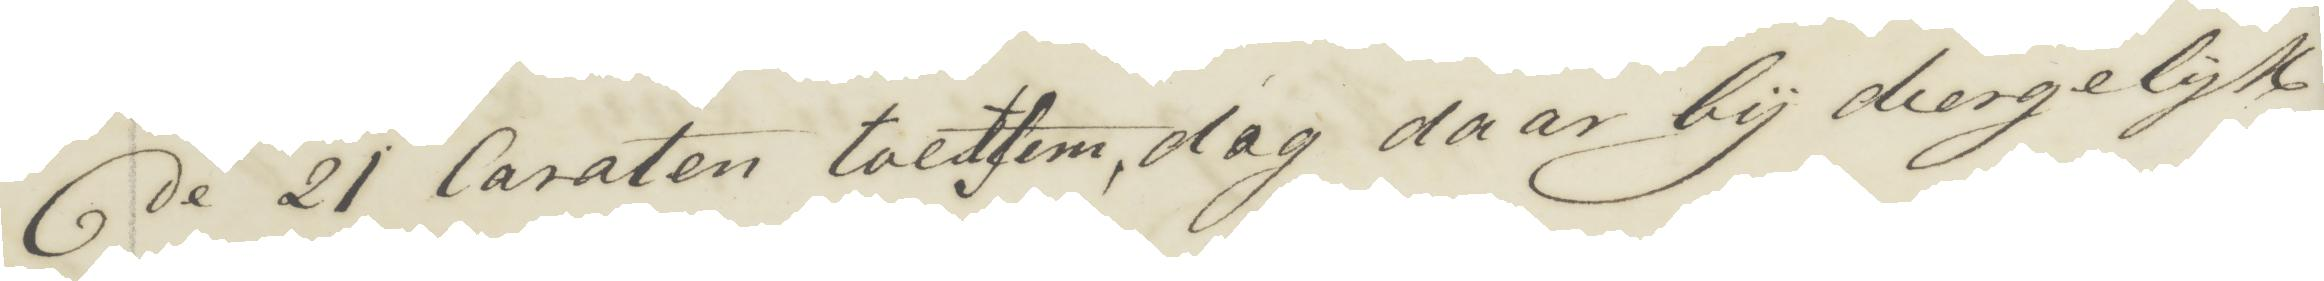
de 21 Caraten toetsen, dog daar bij diergelijk
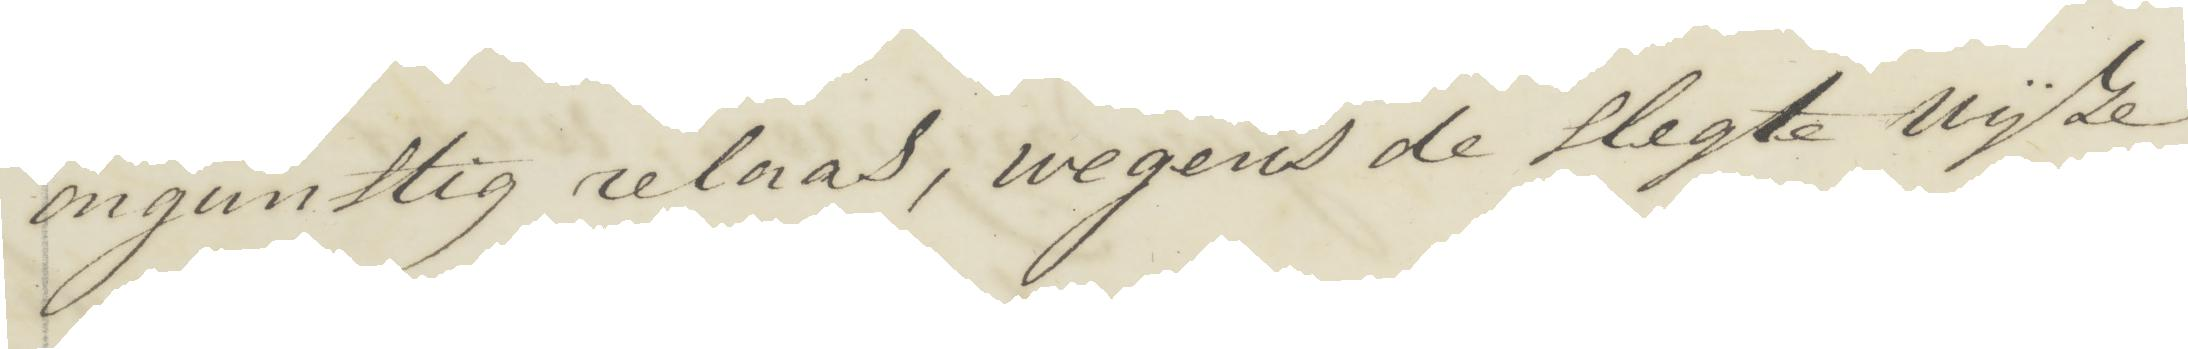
ongunstig relaas, wegens de slegte wijze
